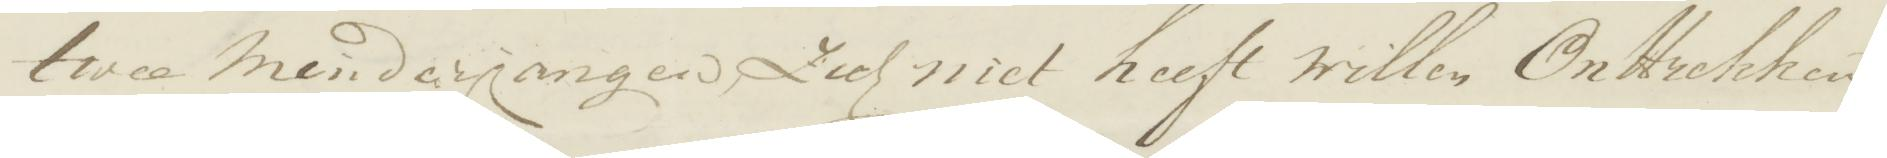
twee minderjarigen, Zich niet heeft willen Onttrekken,
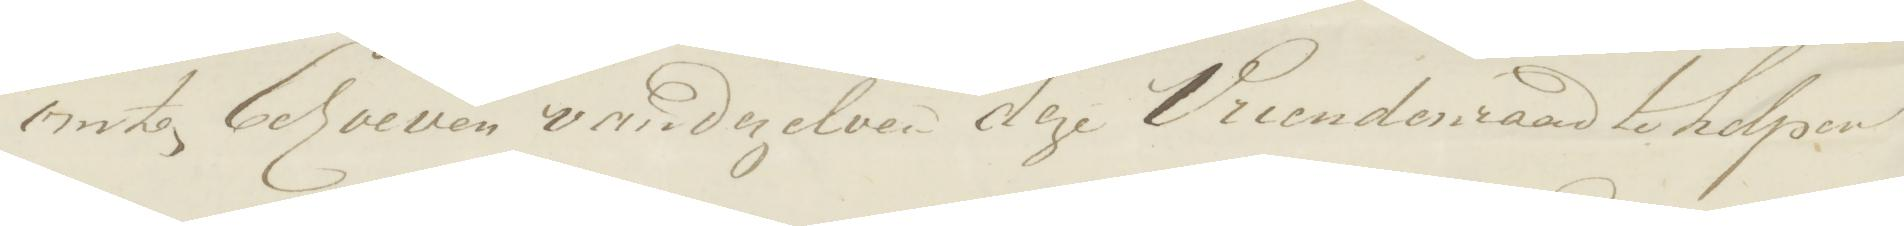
om ten behoeven van dezelven deze Vriendenraad te helpen
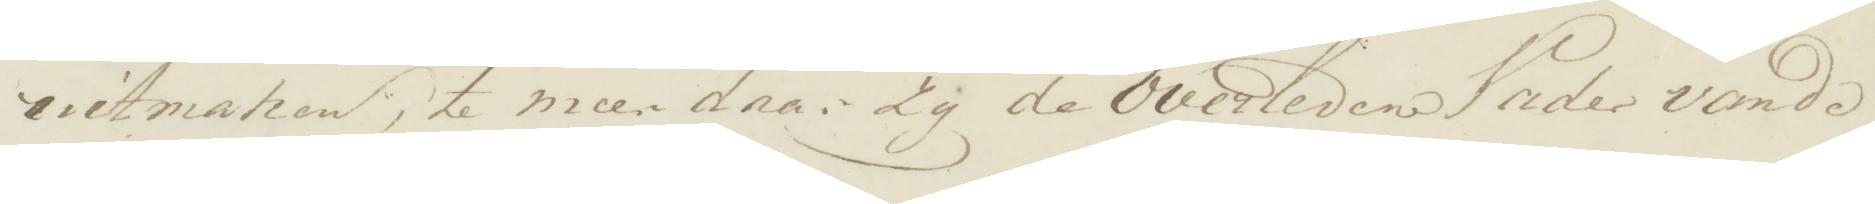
uitmaken, te meer daar zij de overleden Vader van de
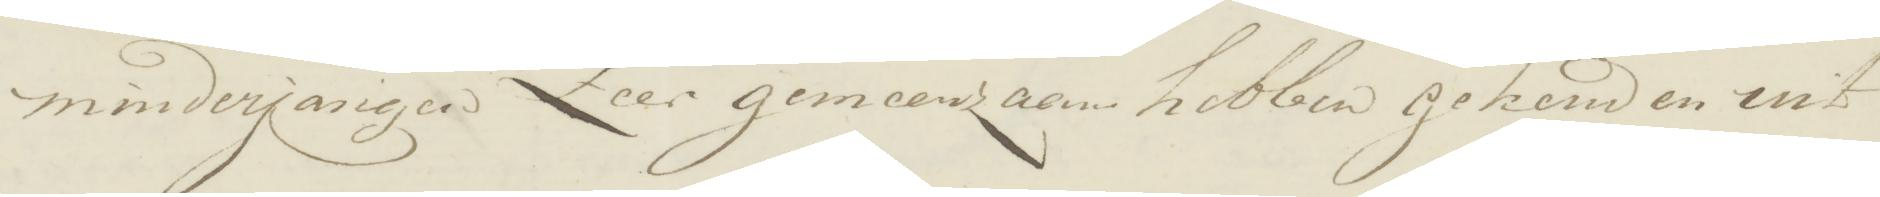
minderjarigen en Zeer gemeenzaam hebben gekend en uit
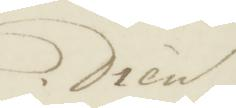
dien
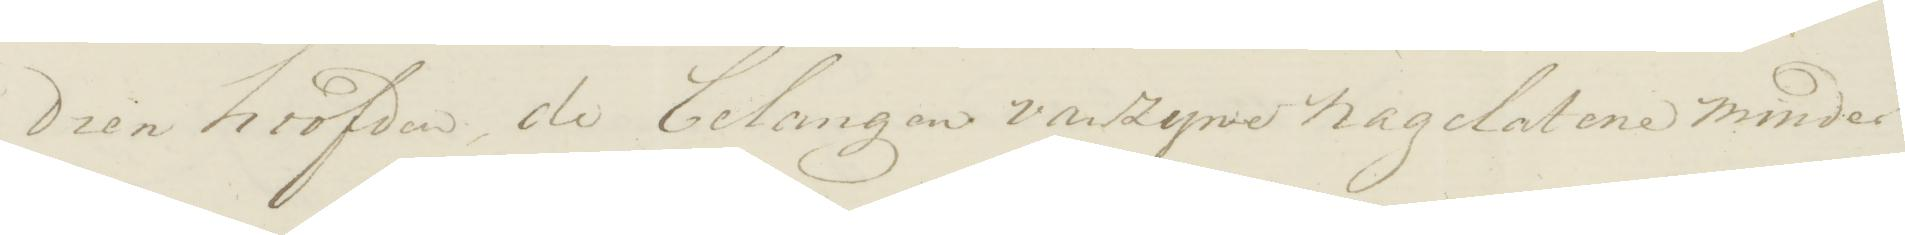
dien hoofden, de belangen van zyne nagelatene minder
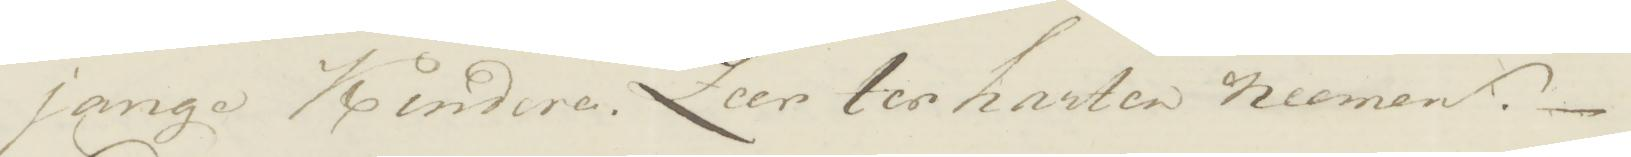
jarige Kindere, Zeer ter harten neemen.
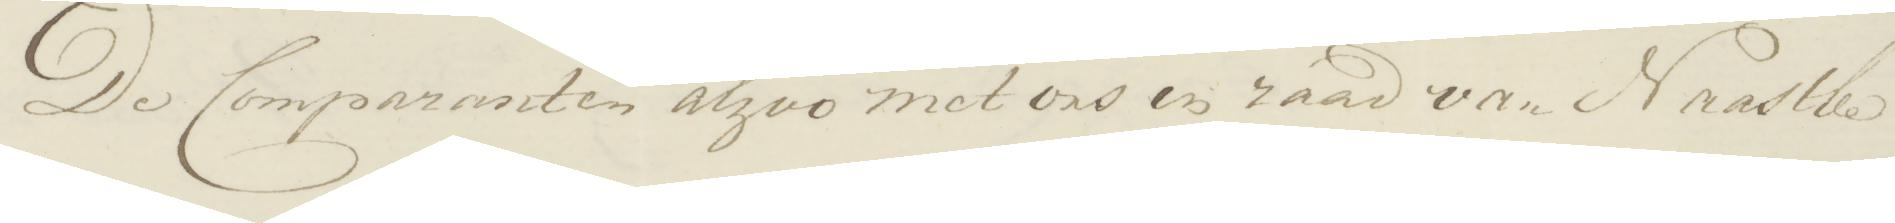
De Comparanten alzoo met ons in raad van Naastbe
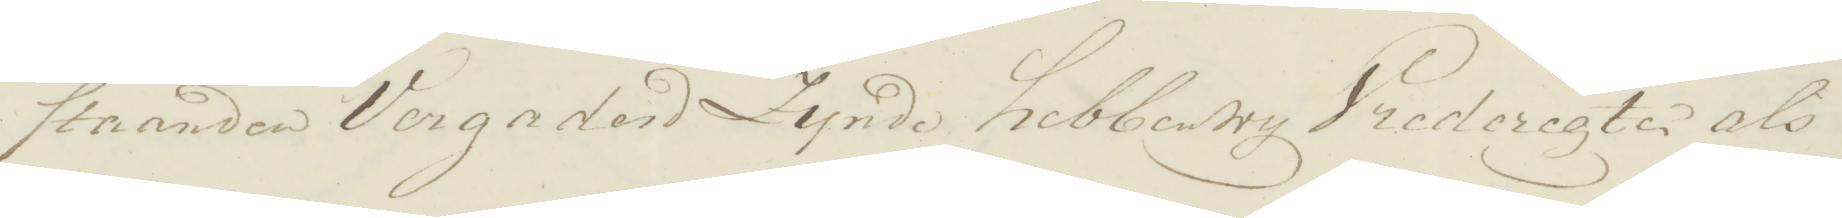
staanden Vergaderd Zynde, hebben wy Vrederegter als
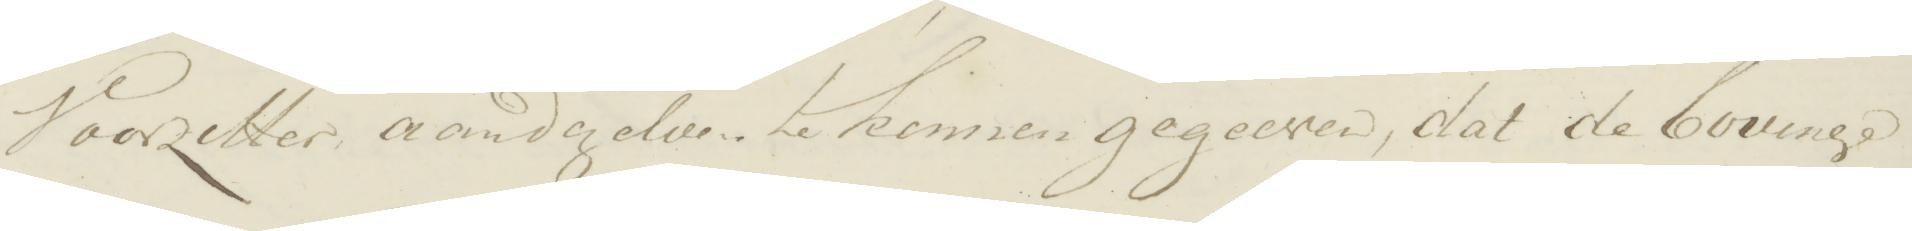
Voorzitter aandezelven te kennen gegeeven, dat de bovenge
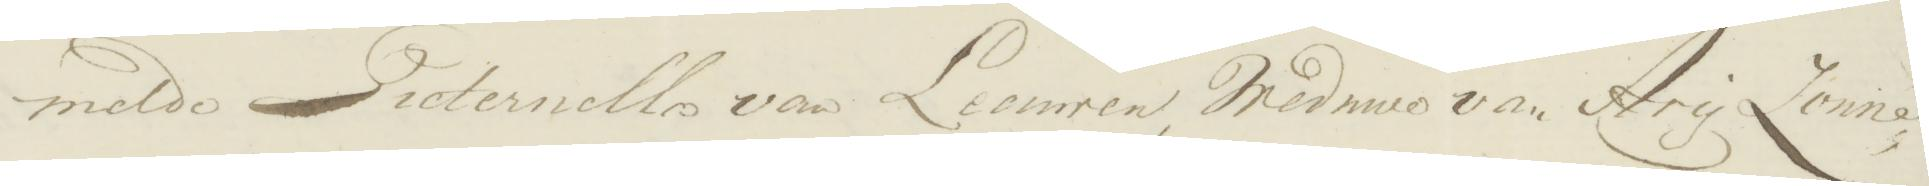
melde Pieternella van Leeuwen, weduwe van Arij Zonne=
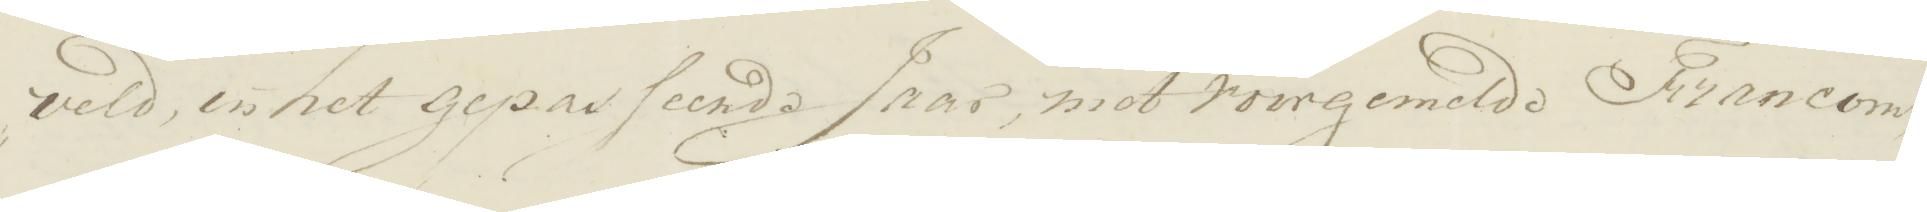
„veld, in het gepasseerde Jaar, met voorgemelde Francom,
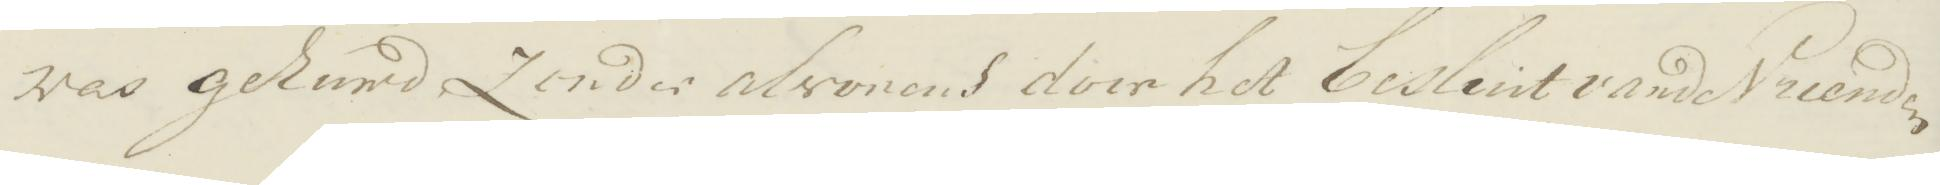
was gehuwd Zonder alvorens door het besluit van de Vrienden
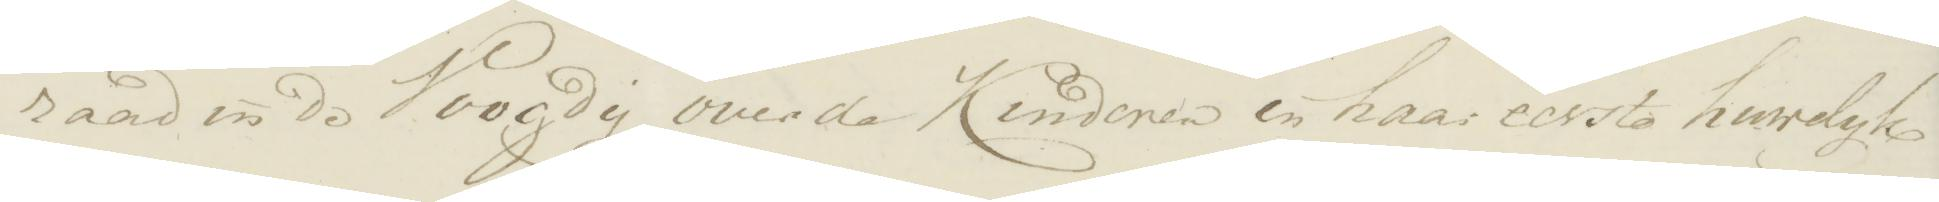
raad in de Voogdij over de Kinderen in haar eerste huwelyk
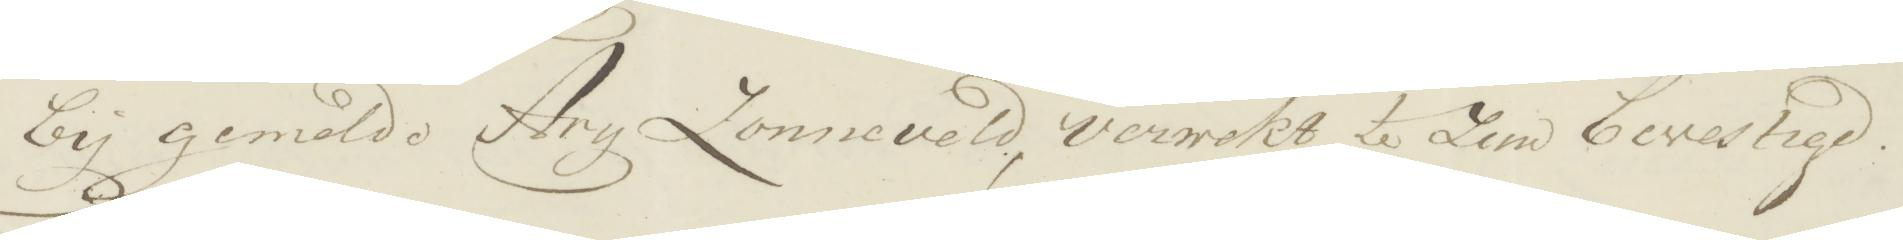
bij gemelde Ary Zonneveld, verwekt, te zyn bevestigd.
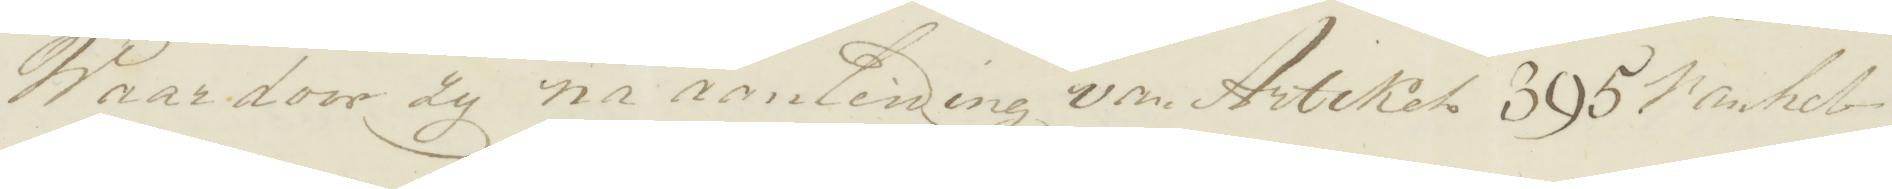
Waardoor zy na aanleiding van Artikel 33 van het
